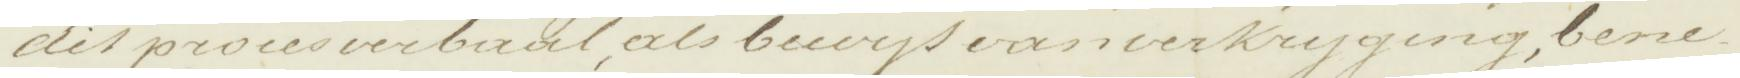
dit procesverbaal, als bewys van verkryging bene
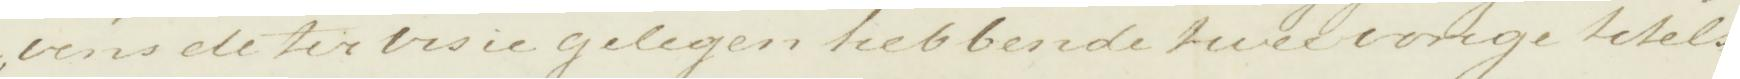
vens de ter visie gelegen hebbende twee vorige titels
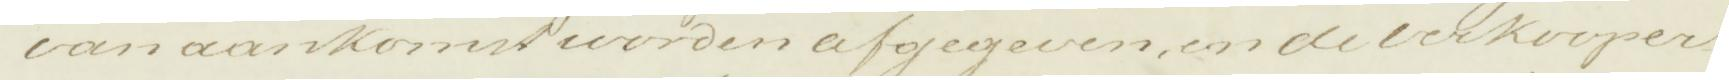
van aankomst worden afgegeven, en de verkooper
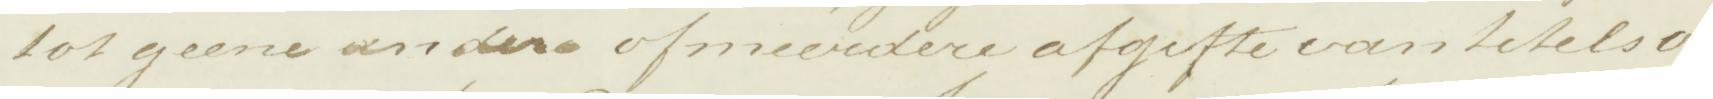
tot geene andere of meerdere afgifte van titels of
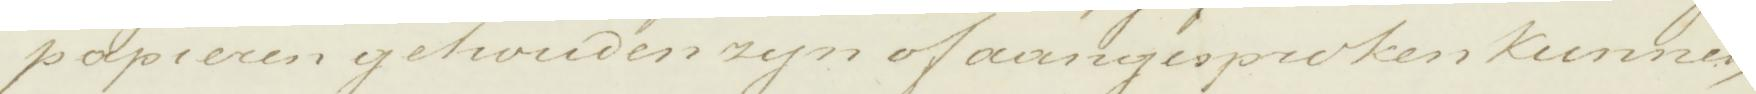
papieren gehouden zyn of aangesproken kunnen
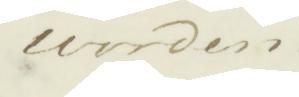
worden
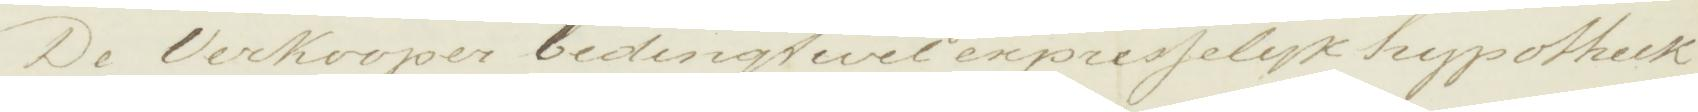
De Verkooper bedingt wel expresselyk hypotheek
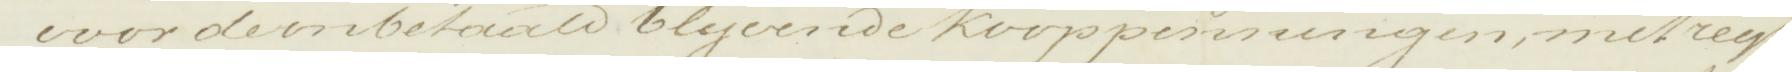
voor de onbetaald blyvende kooppenningen, met regt
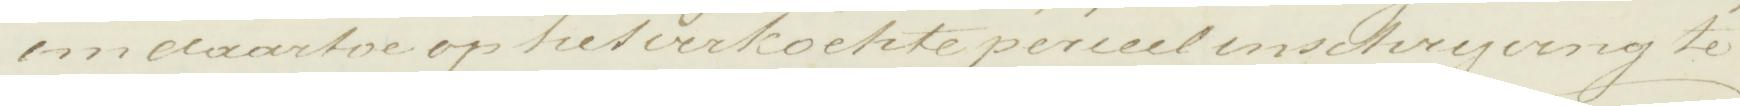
om daartoe op het verkochte perceel inschryving te
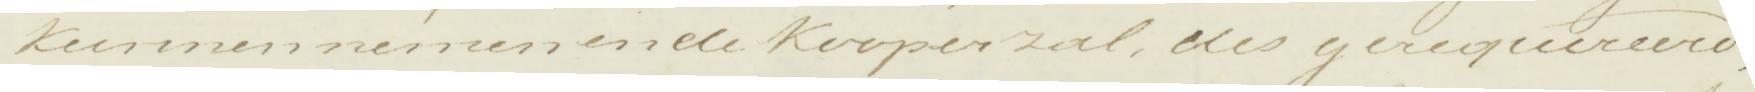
kunnen nemen en de kooper zal, des gerequireerd
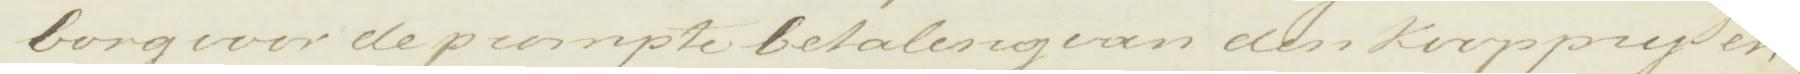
borg voor de prompte betaling van den koopprysen
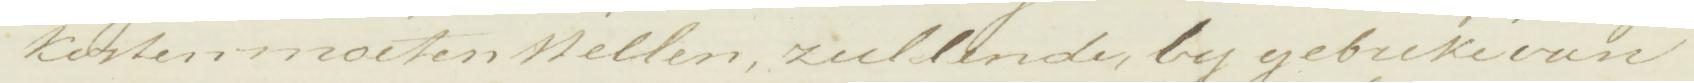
kosten moeten stellen, zullende, by gebreke van
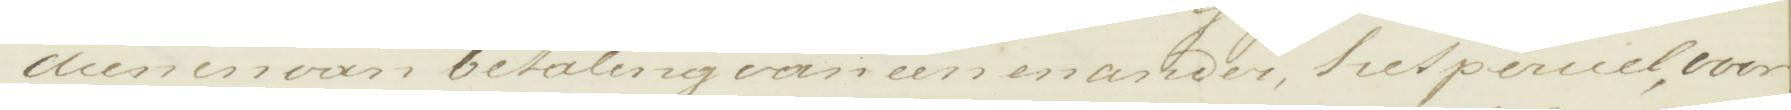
dien en van betaling van een en ander, het perceel, voor
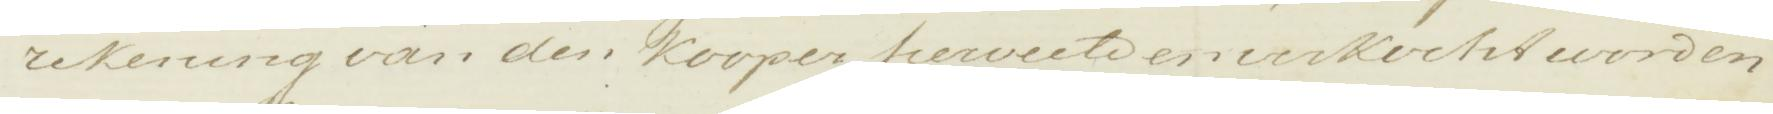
rekening van den kooper, herveild en verkocht worden
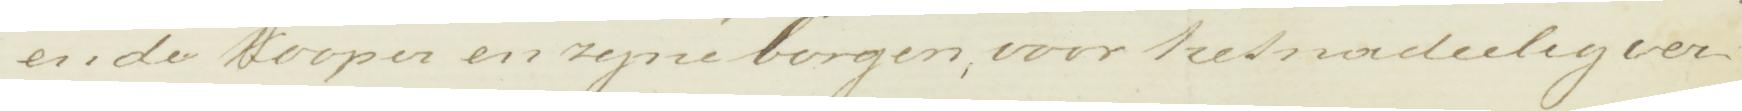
en de kooper en zyne borgen, voor het nadeelig ver.
